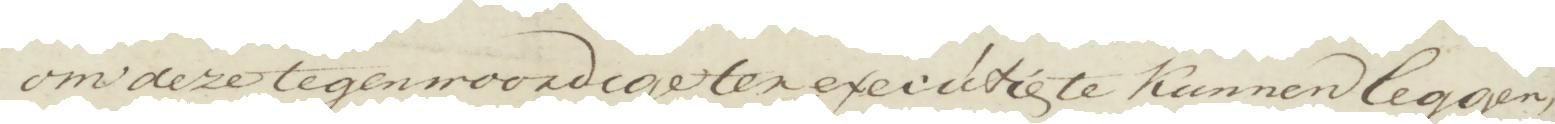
om deze tegenwoordige ter executie te kunnen leggen,
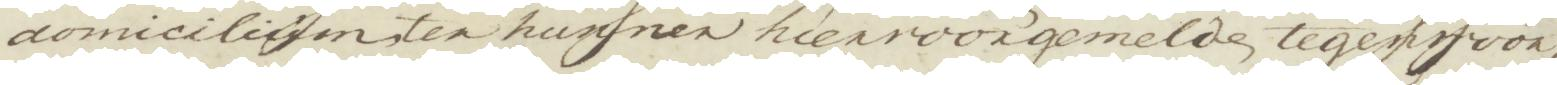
domicilium ter hunnen hiervoor gemelde tegenwoor
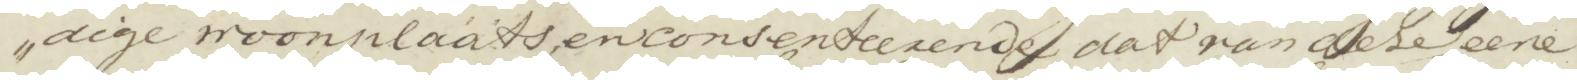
„dige woonplaats, en consenteerende dat van deze eene
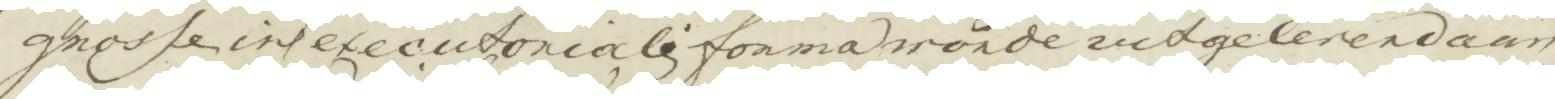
grosse in executoriale somma worde uitgeleverd aan
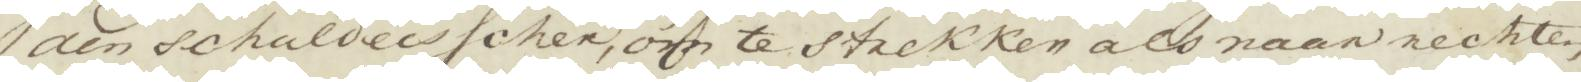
den schuldeisscher, om te strekken als naar rechten
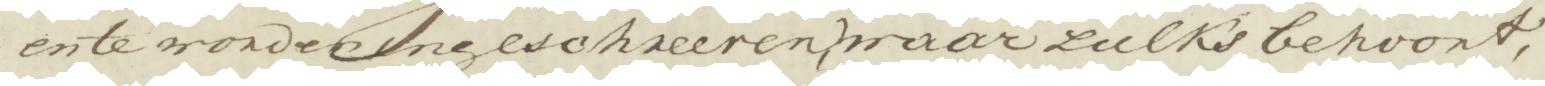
en te worden ingeschreeven waar zulks behoort,
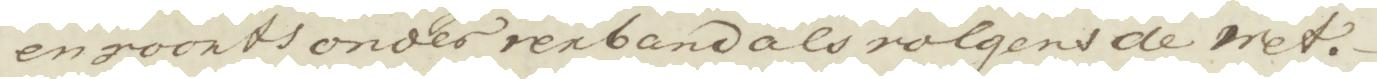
en voorts onder verband als volgens de wet.-
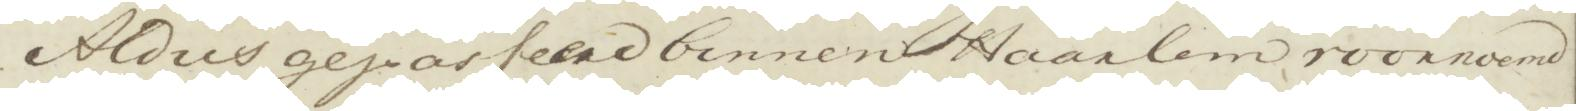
Aldus gepasseerd binnen Haarlem voornoemd
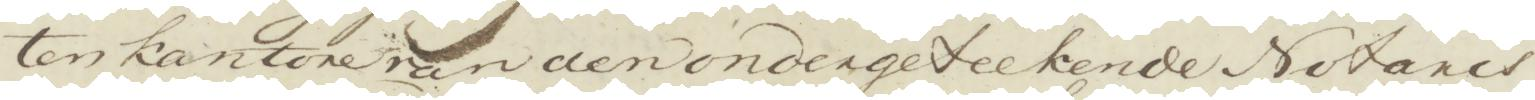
ten kantore van den ondergeteekende Notaris
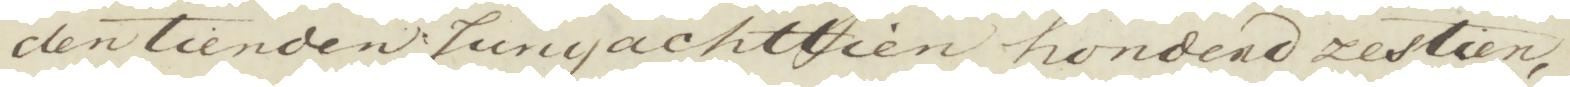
den tienden Juny achttien honderd zestien,
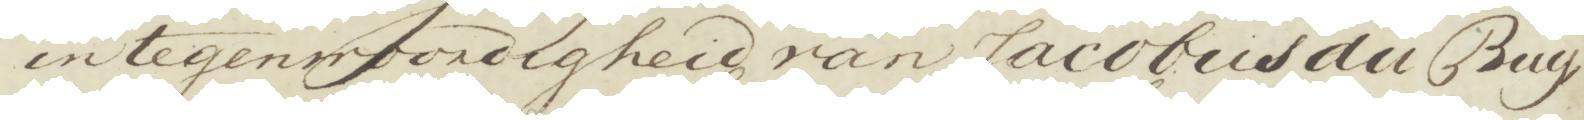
in tegenwoordigheid van Jacobus du Buy
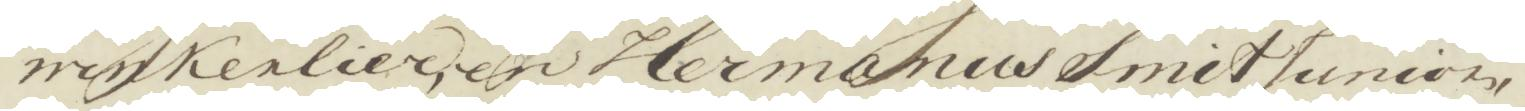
winkerlier, en Hermanus Smit Junior,
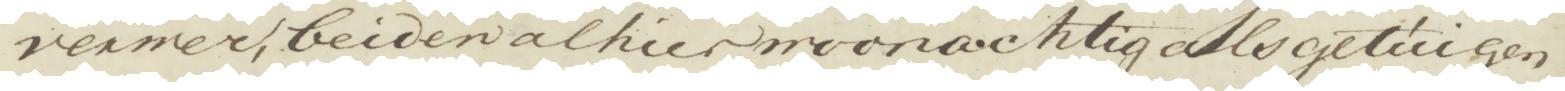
verwer, beiden alhier woonachtig als getuigen
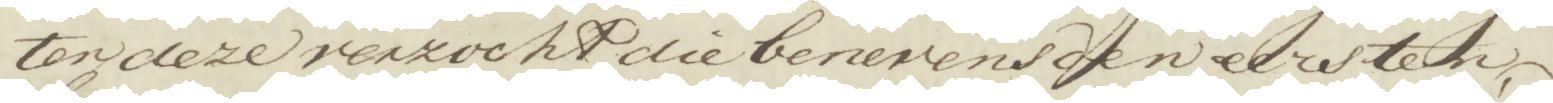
ten deze verzocht die benevens den eersten
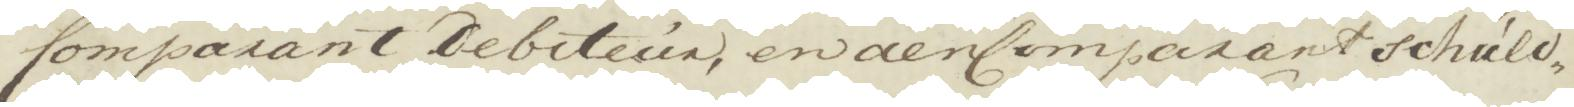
Comparant Debiteur, en den Comparant schuld„
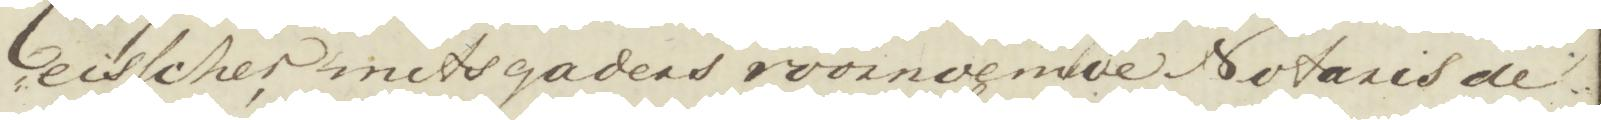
„eisscher mitsgaders voornoemde Notaris de
